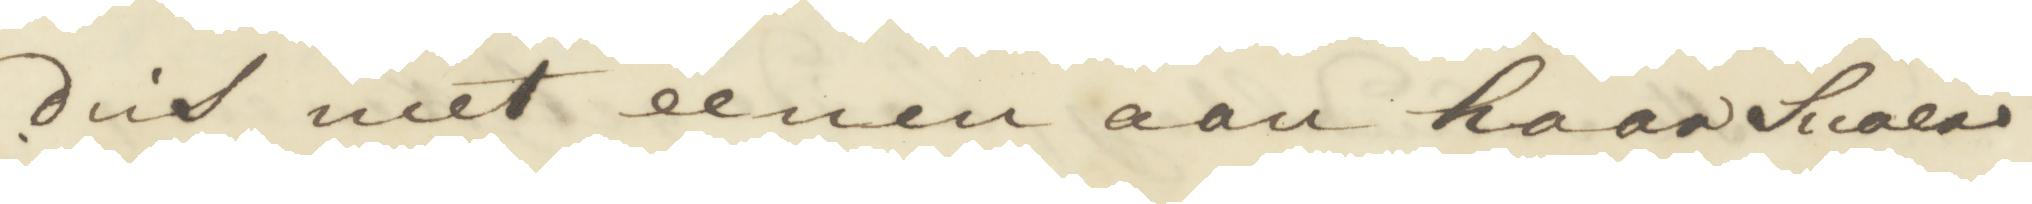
dus met eenen aan haar haer
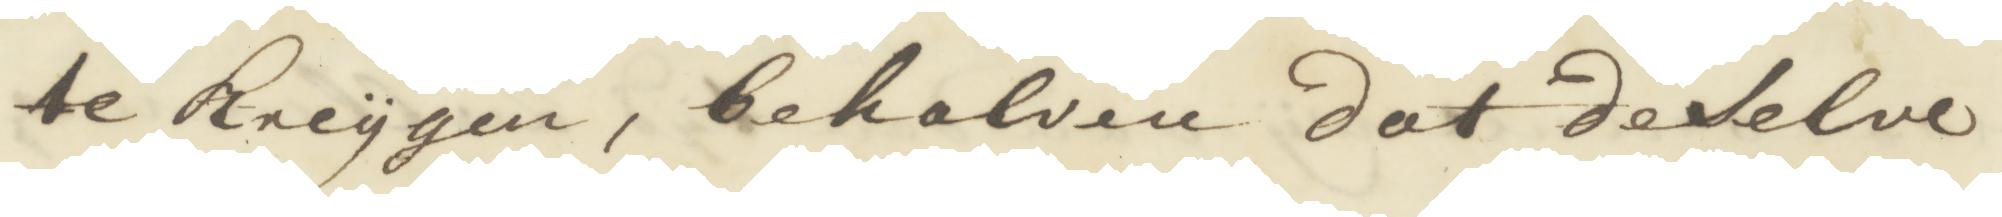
te kreijgen, behalven dat deselve
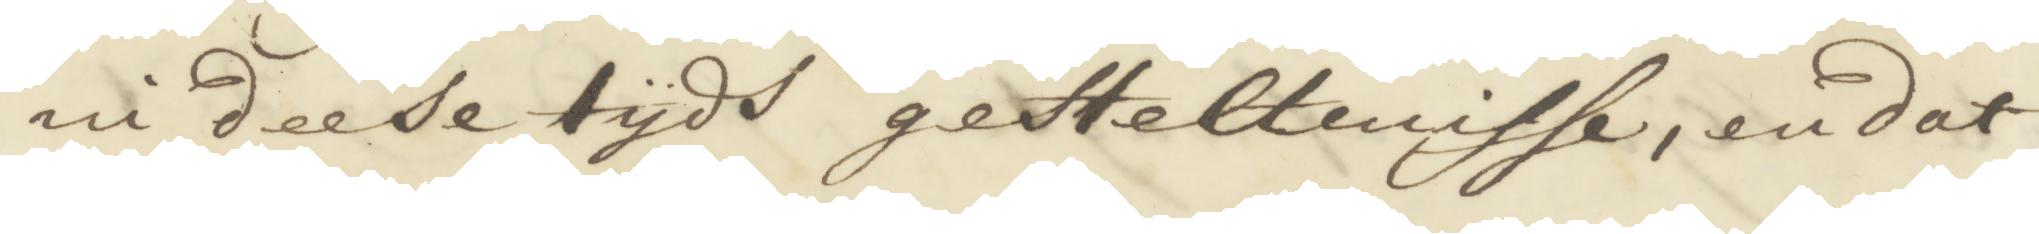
in deese tijds gesteltenisse, en dat
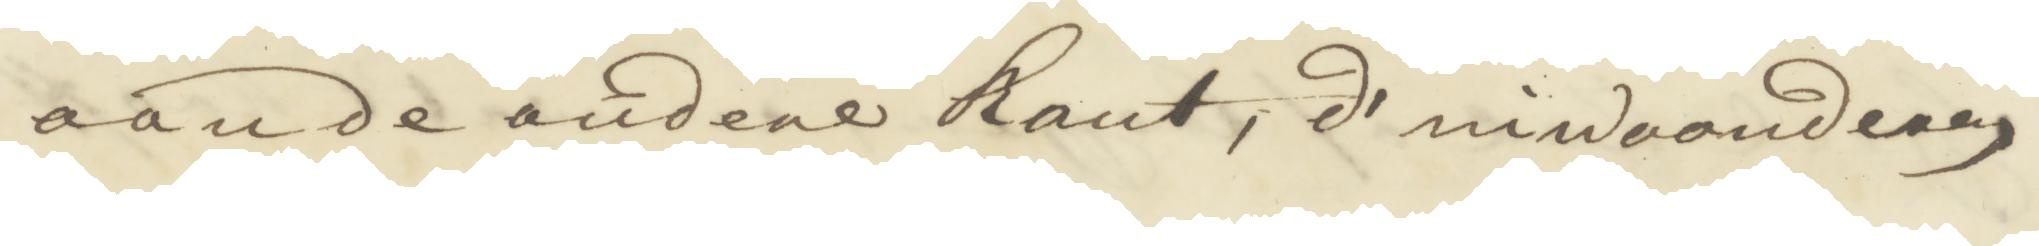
aan de andere kant, d’ inwoonderen
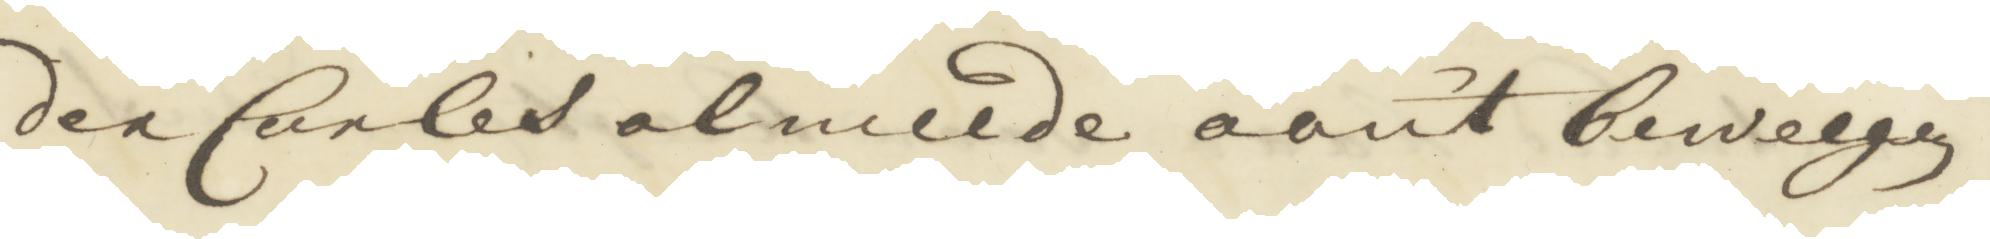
der Corles almeede aan’t beweegen
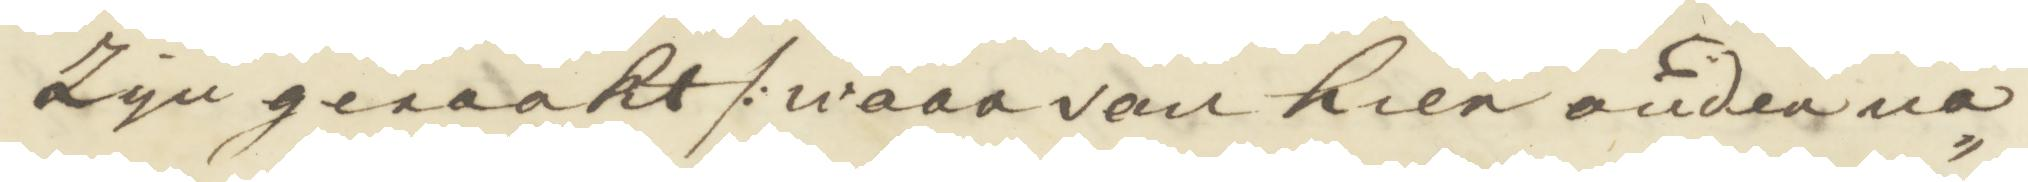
Zijn geraakt /: waar van hier onder na„
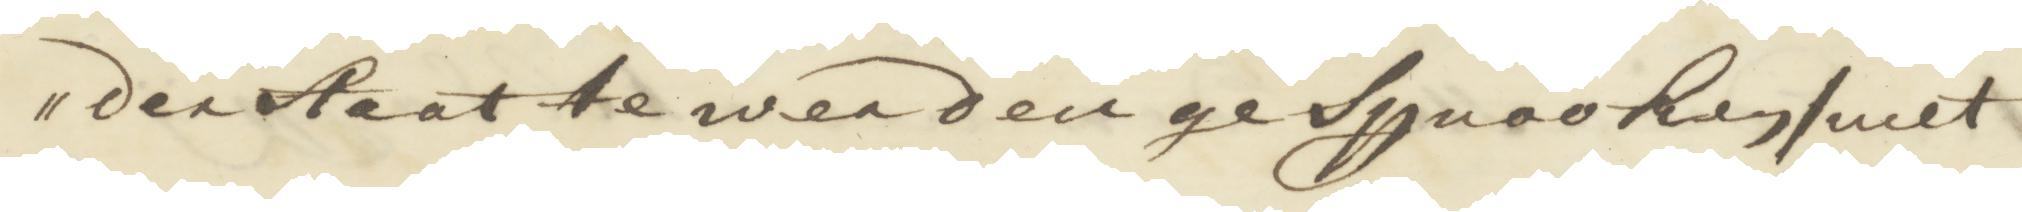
„der Staat te werden gesprooken / met
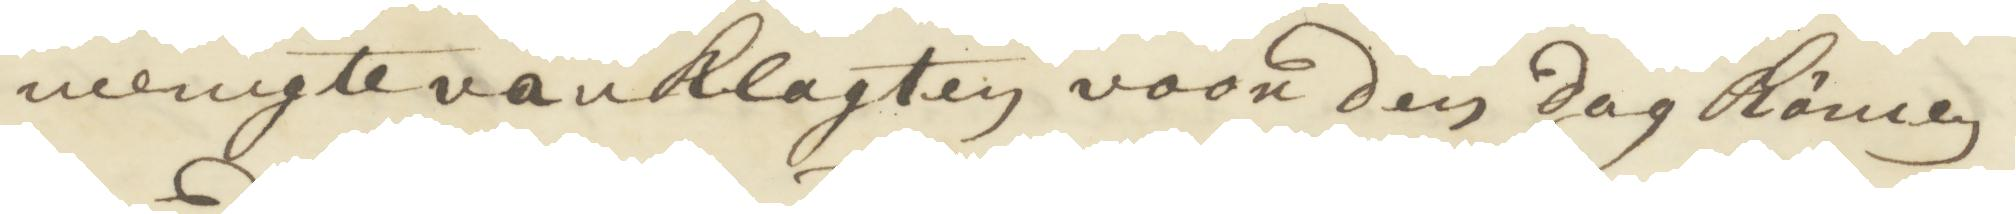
menigte van klagten voor den dag komen
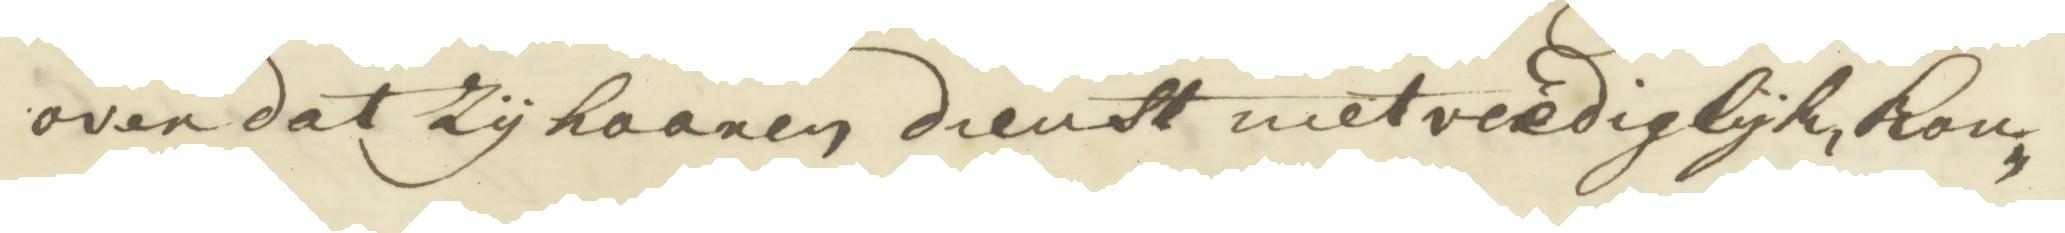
over dat zij haaren dienst niet verdiglijk, kon„
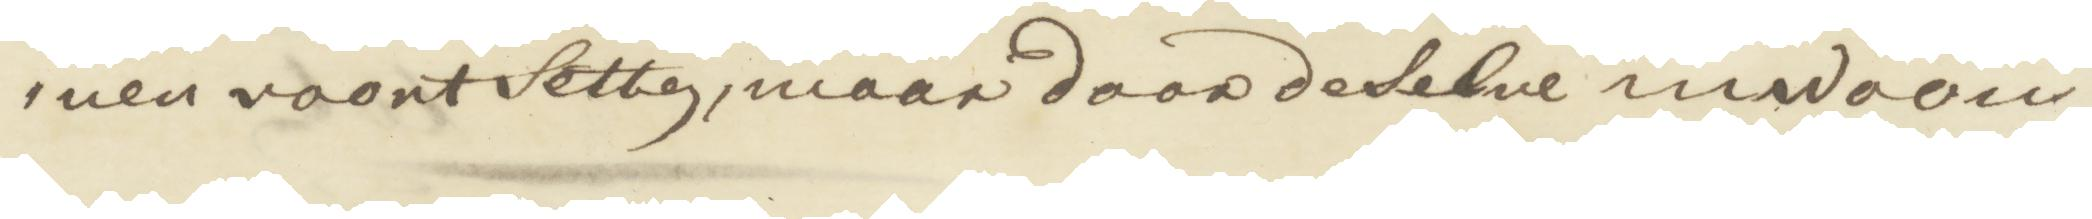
„nen voortsetten, maar door deselve inwoon
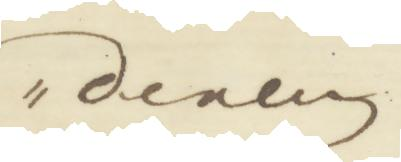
„deren
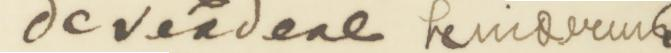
de verdere kindernis
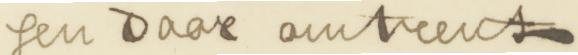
sen daar omtrent
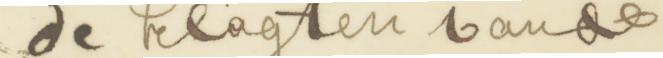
de klagten vande
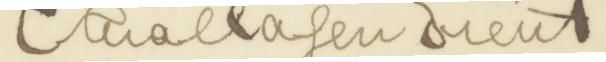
Chiallasen dient
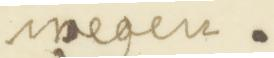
wegen.
